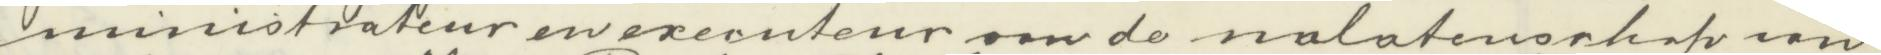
ministrateur en executeur van de nalatenschap van
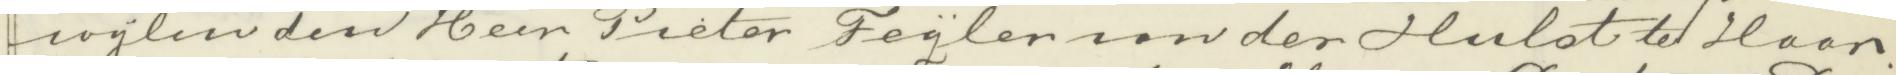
wijlen den Heer Pieter Teijler van der Hulst te Haar.
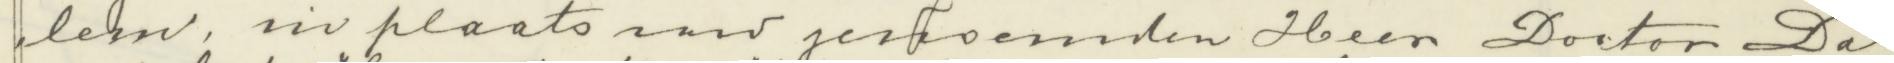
lem, in plaats van genoemden Heer Doctor Da
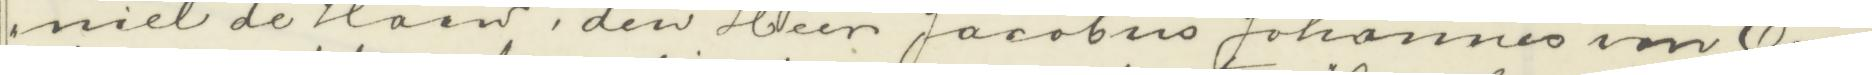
„niel de Haan, den Heer Jacobus Johannes van Oor
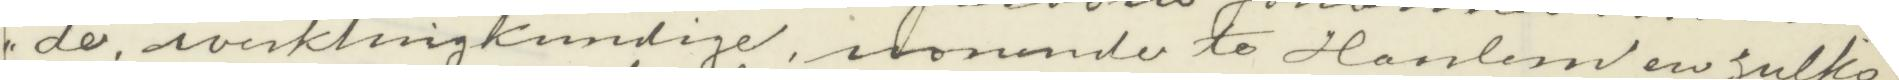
„de, werktuigkundige, wonende te Haarlem en zulks
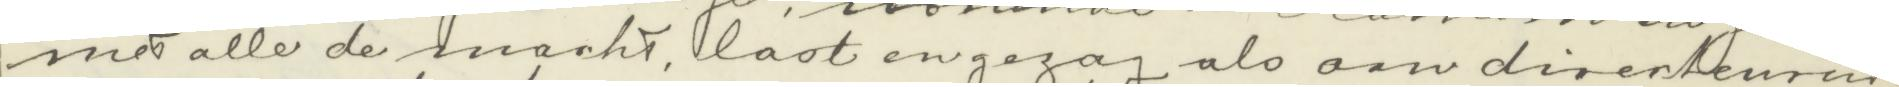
met alle de macht, last en gezag als aan directeuren
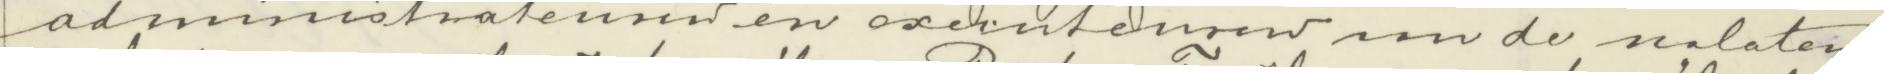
administrateuren en executeuren in de nalaten
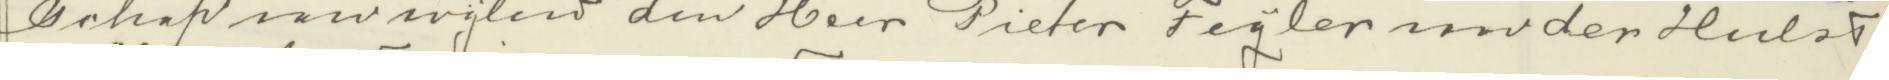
schap van wijlen den Heer Pieter Teijler van der Hulst
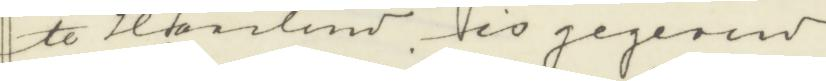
te Haarlem is gegeven
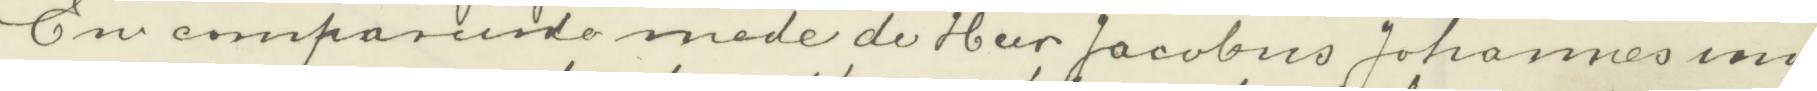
En compareerde mede de Heer Jacobus Johannes van
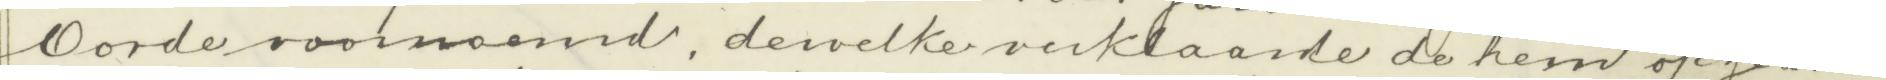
Oorde voornoemd, dewelke verklaarde de hem opgedra
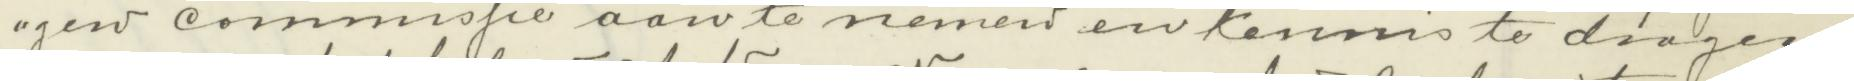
„gen commissie aan te nemen en kennis te dragen
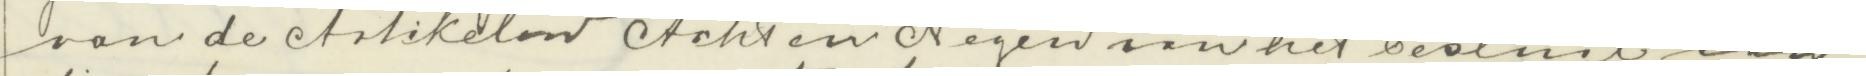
van de Artikelen Acht en Negen van het besluit evan
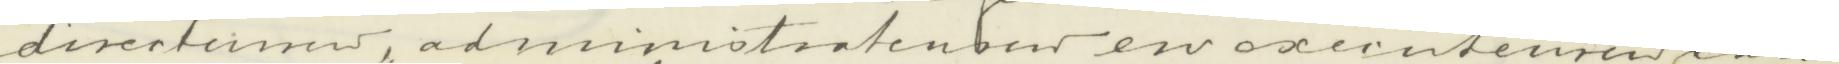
directeuren, administrateuren en executeuren van
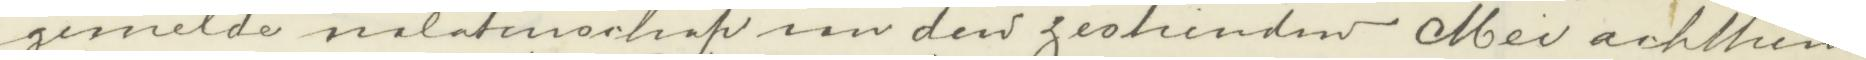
gemelde nalatenschap van den zestienden Mei achttien
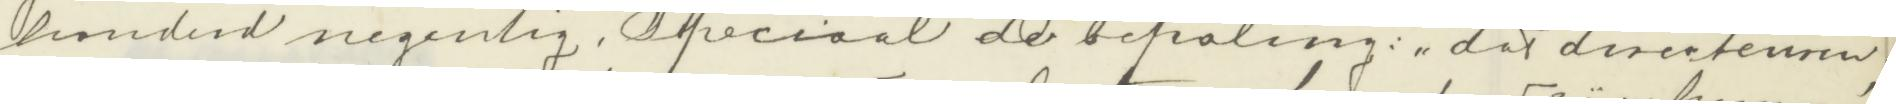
honderd negentig, speciaal de bepaling: „dat directeuren,
